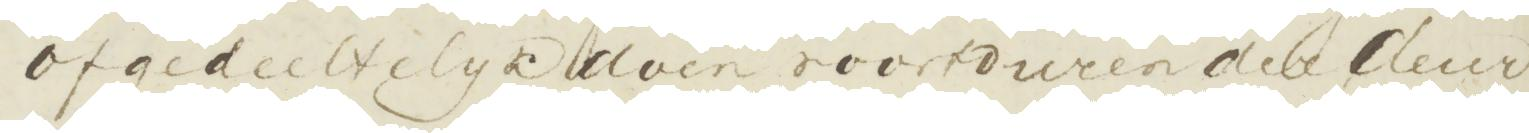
of gedeeltelyk doen voorduren der deur
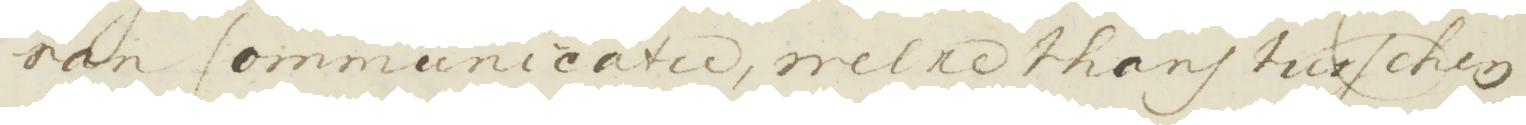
van Communicatie, welke thans tusschen
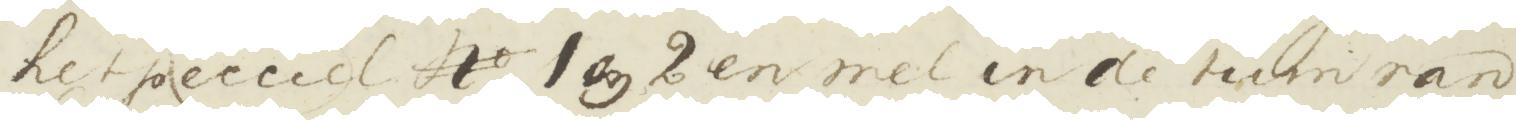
het perceel N:o 1 en 2 en wel in de tuin van
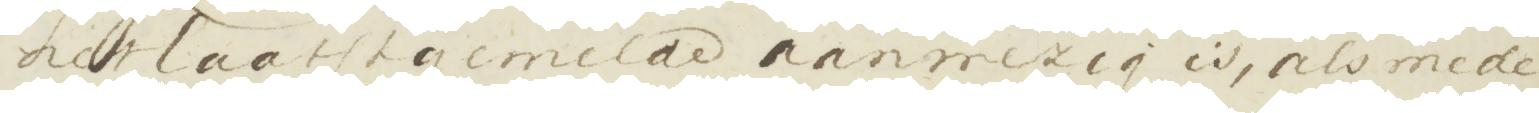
het laatstgemelde aanwezig is, als mede
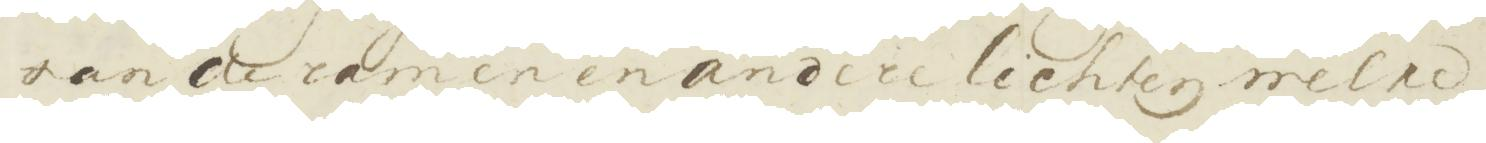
van de ramen en andere lichten welke
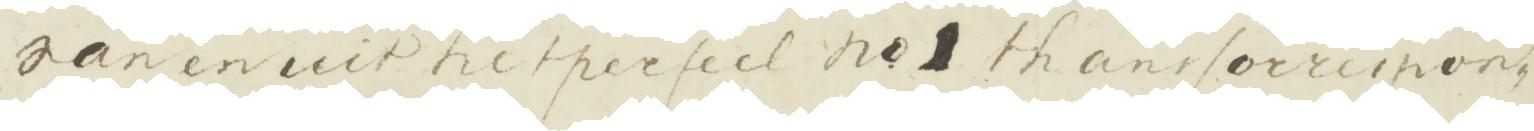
van en uit het perceel no 1 thans correspon
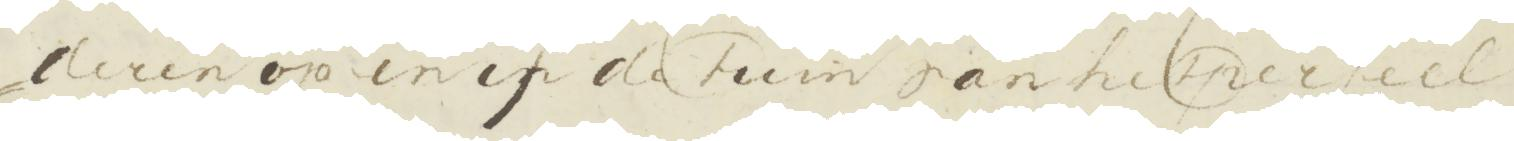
„deren op en in de tuin van het perceel
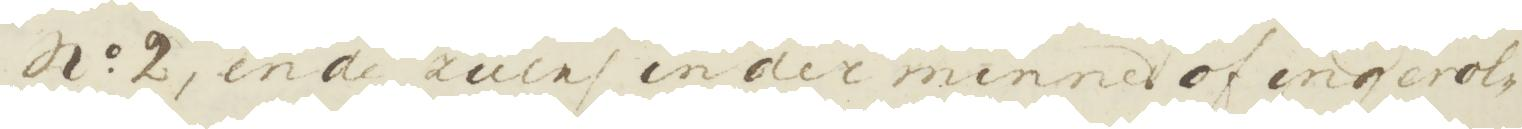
N.o 2, ende zulks in der minne of ingevol„
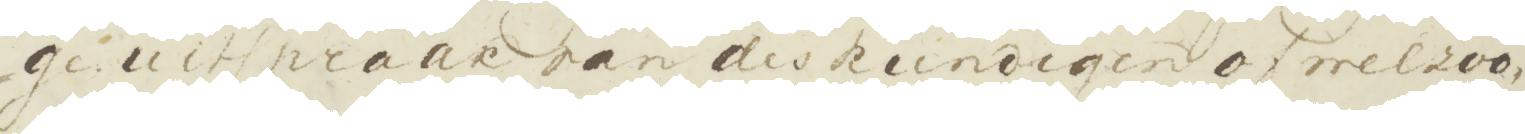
„ge uitspraak van deskundigen of wel zoo„
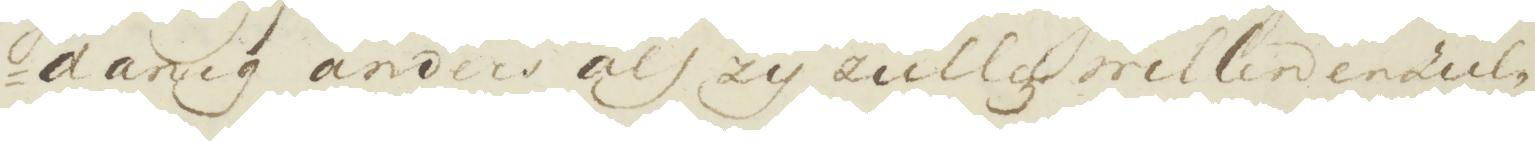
„danig anders als zy zullen willen en zul„
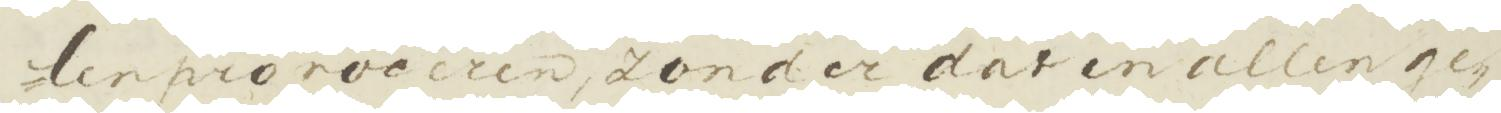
„len provoceren, zonder dat in allen ge
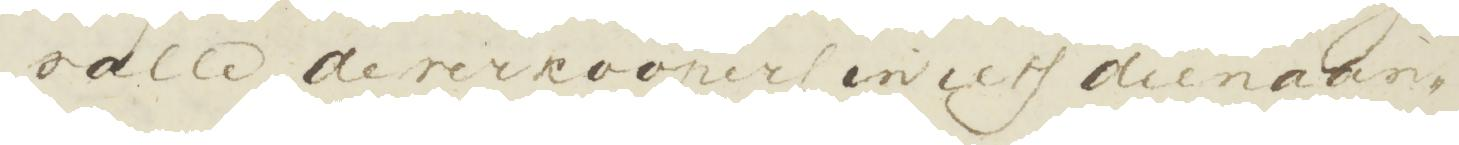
valle de verkooper en iets dien aan„
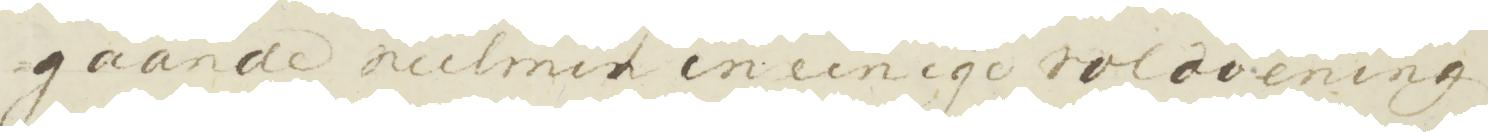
„gaande nietmin in eenige voldoening
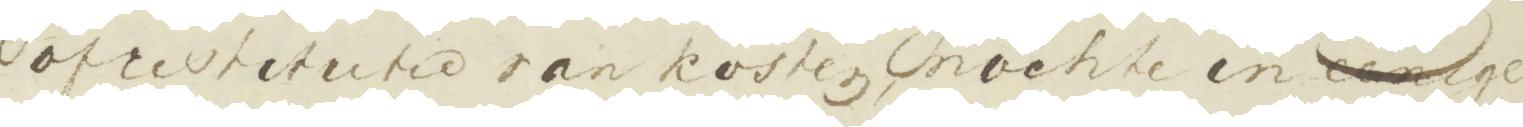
of restitutie van kosten, mochte in eenige
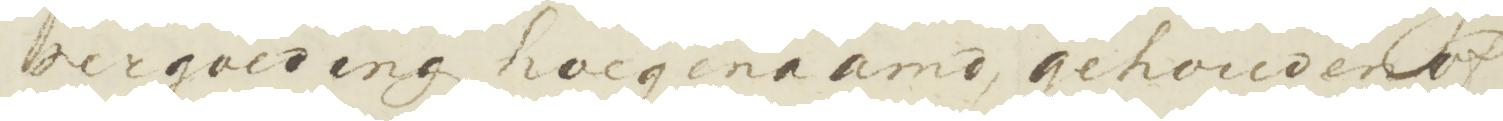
vergoeding hoegenaamd, gehouden of
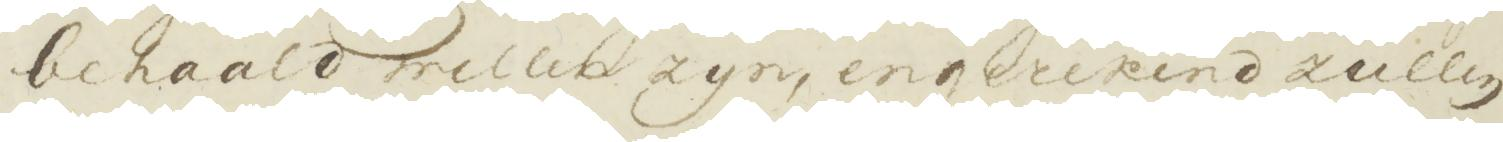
behaald willen zyn, en gerekend zullen
